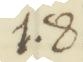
1.8
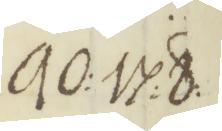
40:17:8.
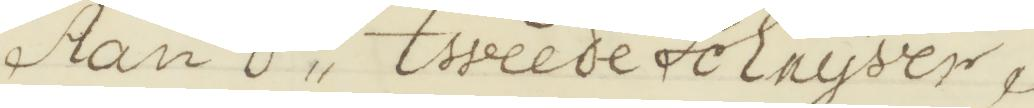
Aan d„to tweede schrijver
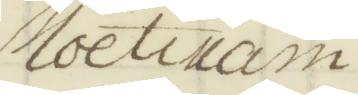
Moetiram
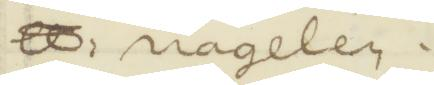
1„ lb: nagelen.
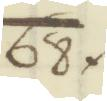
68ƒ
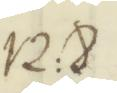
12:8
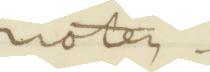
noten
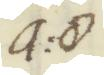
4. 4:8
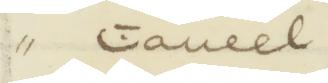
1 „ caneel
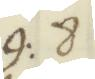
3. 9: 8
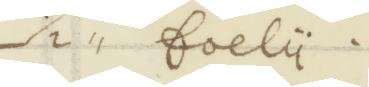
½„ foelij
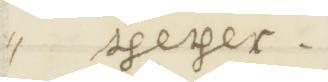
5: „ peper -
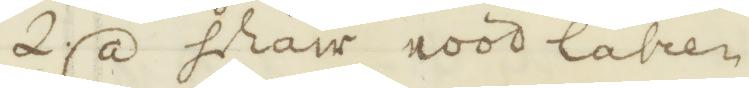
2. @ schair rood laken
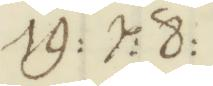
19: 7: 8:
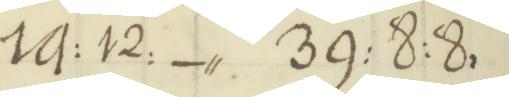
14: 12: —„ 39:8:8:
